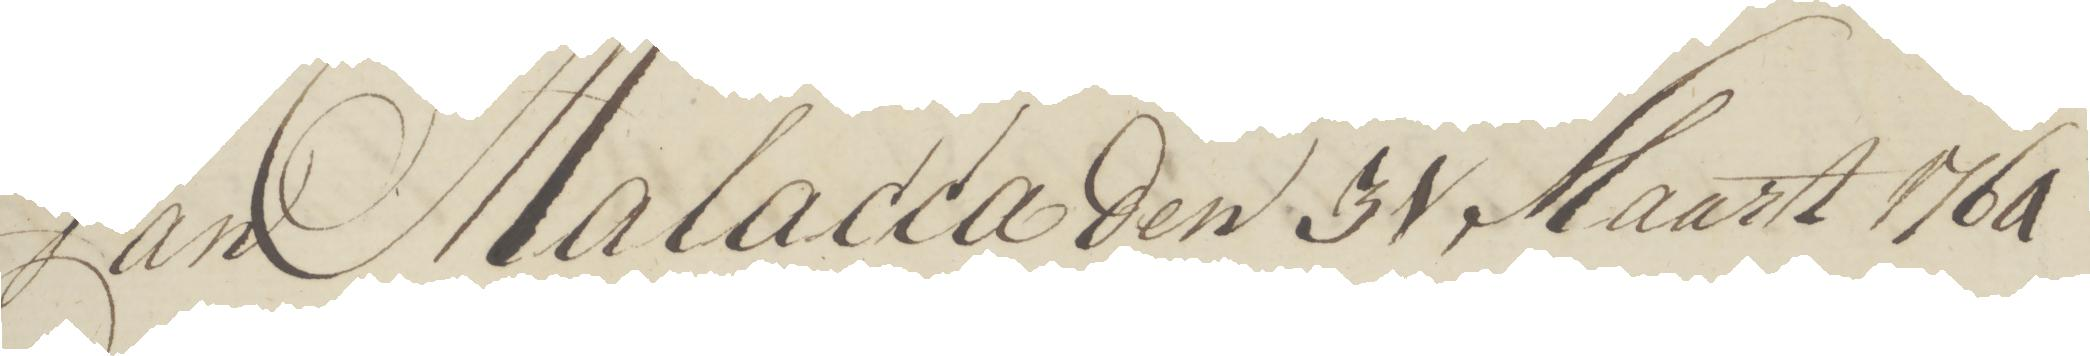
Van Malacca den 31 Maart 1764
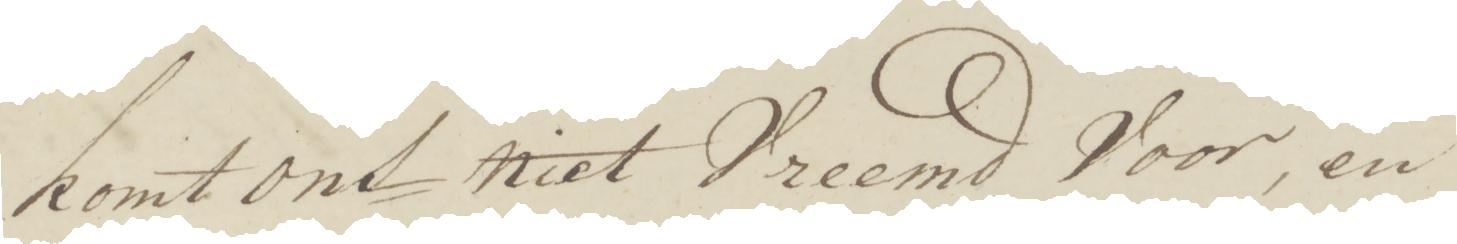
komt ons niet Vreemd voor, en
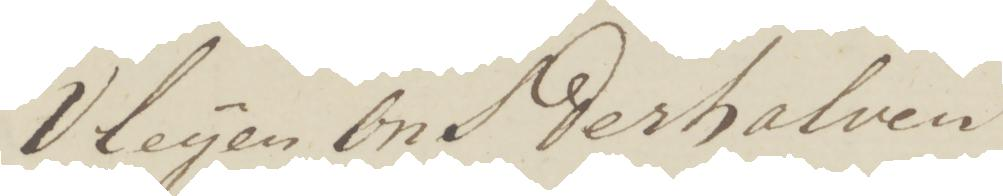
Vleijen ons derhalven
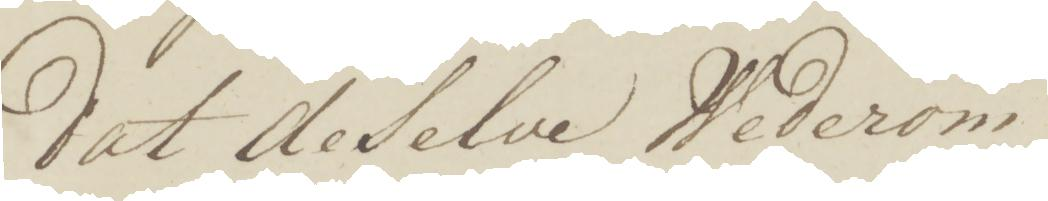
dat deselve Wederom
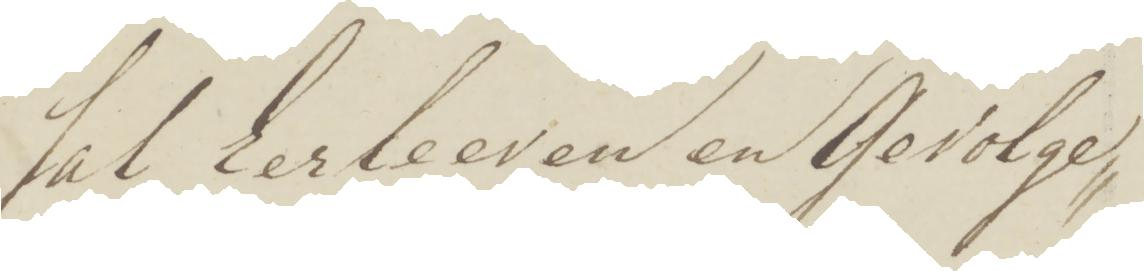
sal herleeven en Gevolge„
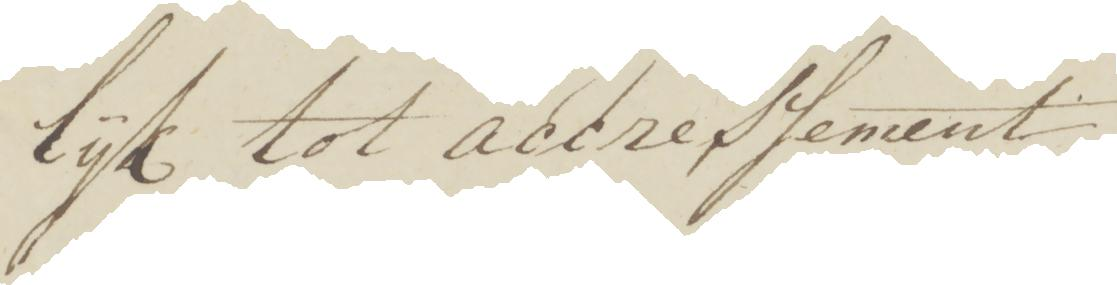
lijk tot accressement
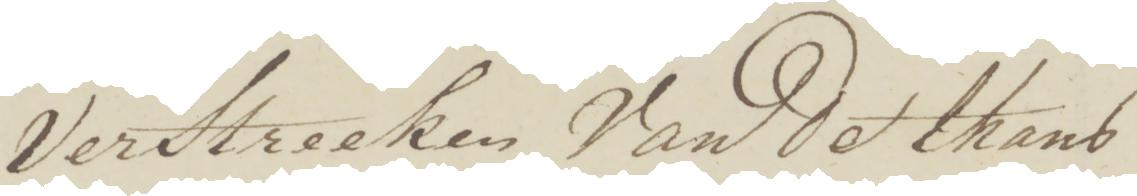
verstreeken van de thans
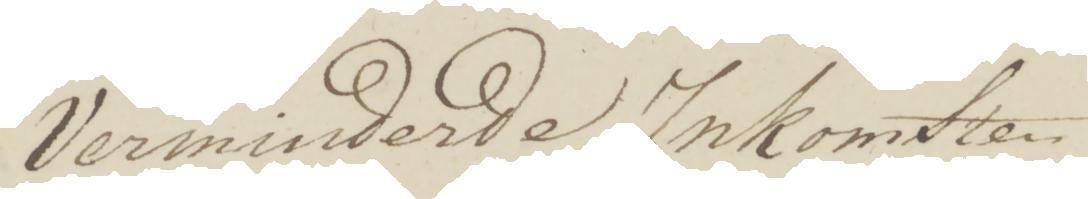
verminderde Jnkomsten
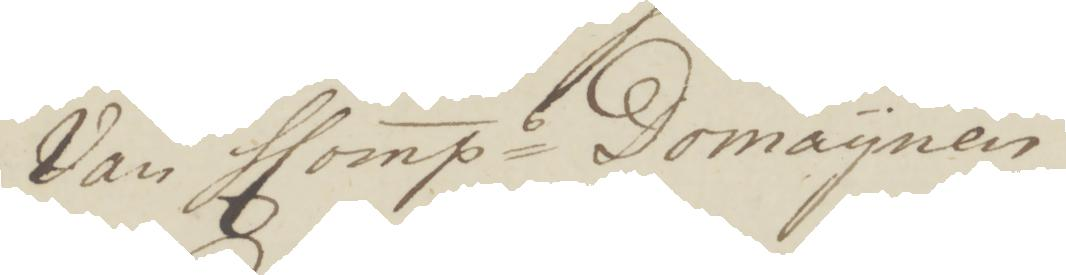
Van s Comp=s Domaijnen
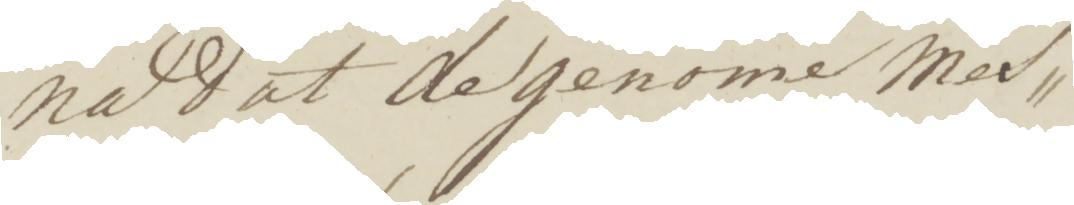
na dat de genome mes„
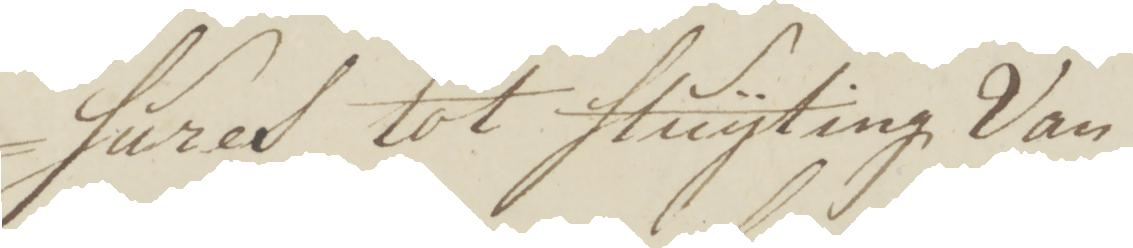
„sures tot stuijting van
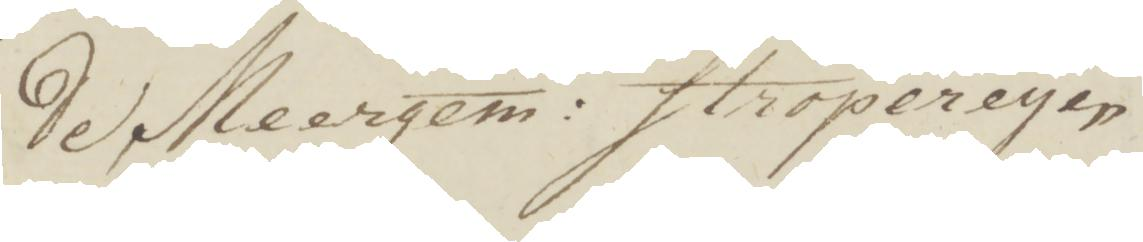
de Meergem: stropereijen
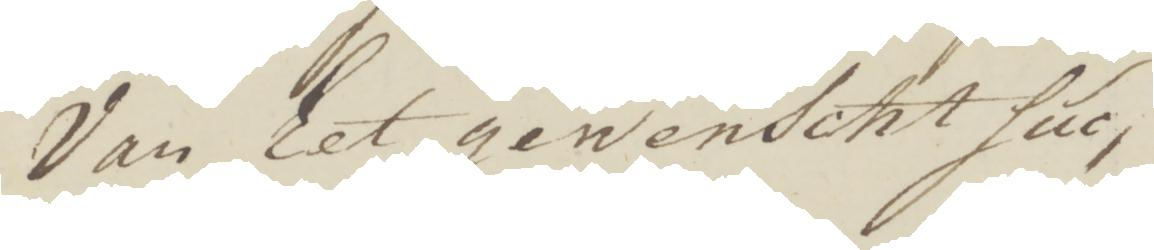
van het gewenscht suc„
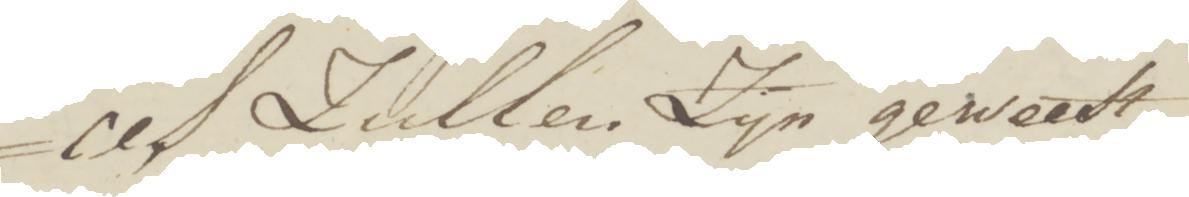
„ces zullen zijn geweest,
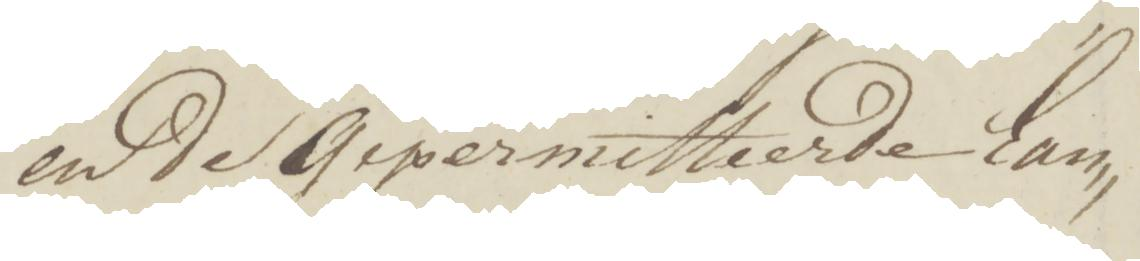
en de gepermitteerde han„
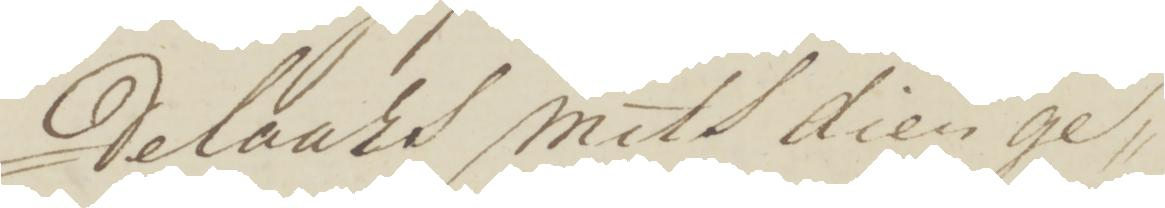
„delaars mits dien ge„
